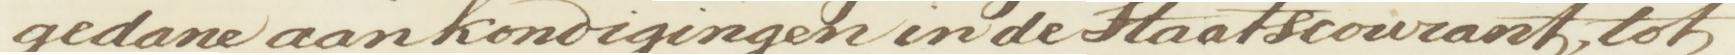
gedane aankondigingen in de Staatscourant, tot
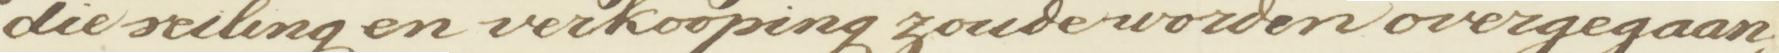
die veiling en verkooping zoude worden overgegaan,
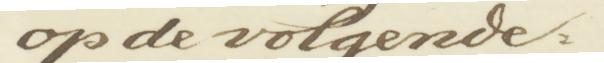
op de volgende=
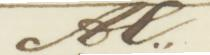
Al„
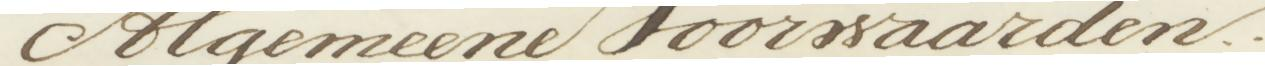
Algemeene Voorwaarden..
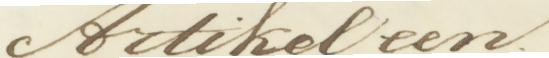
Artikel een.
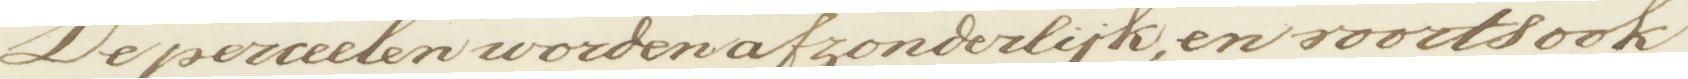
De perceelen worden afzonderlijk, en voorts ook
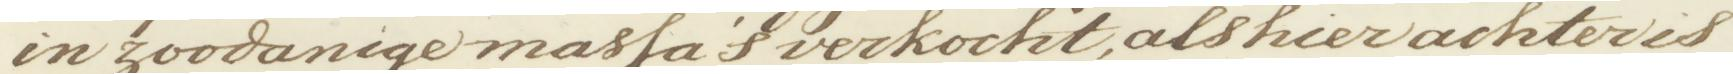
in zoodanige massa's verkocht, als hier achter is
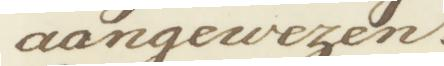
aangewezen.
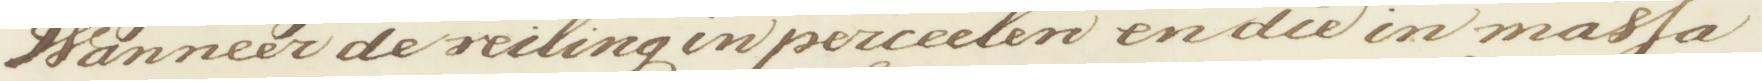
Wanneer de veiling in perceelen en die in massa
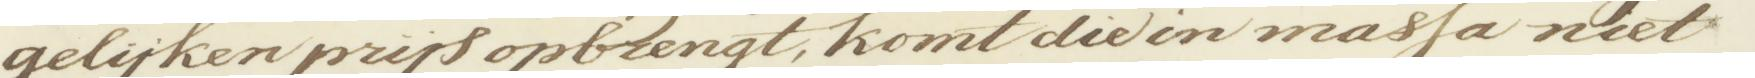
gelijken prijs opbrengt, komt die in massa niet
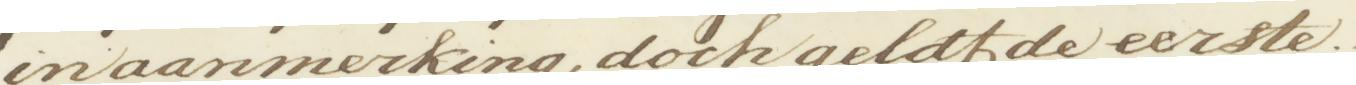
in aanmerking, doch geldt de eerste.
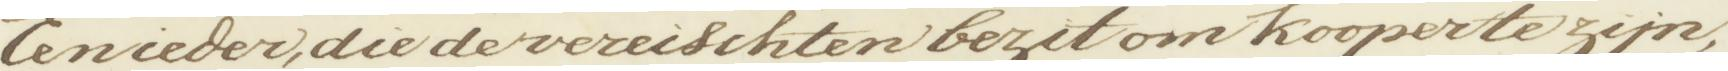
Een ieder, die de vereischten bezit om kooper te zijn,
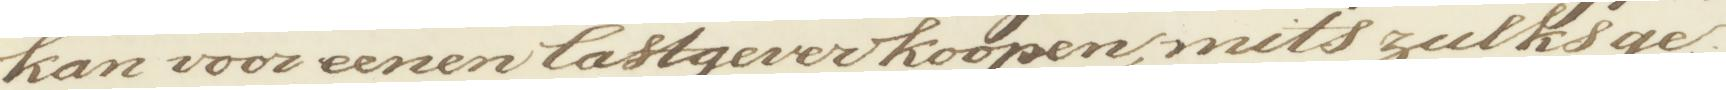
kan voor eenen lastgever koopen, mits zulks ge„
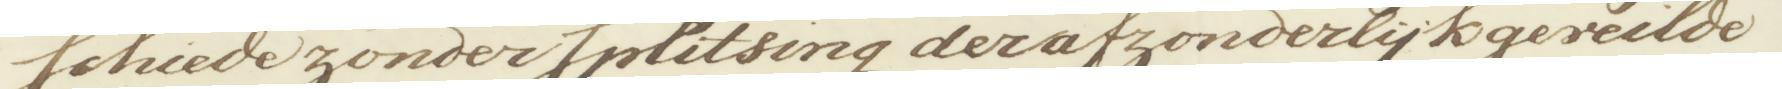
schiede zonder splitsing der afzonderlijk geveilde
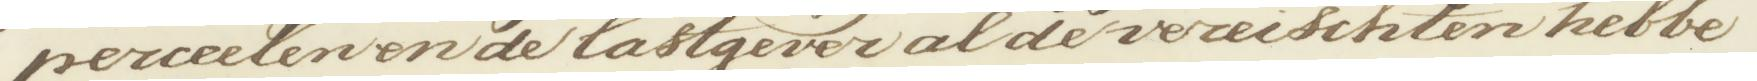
perceelen en de lastgever al de vereischten hebbe
